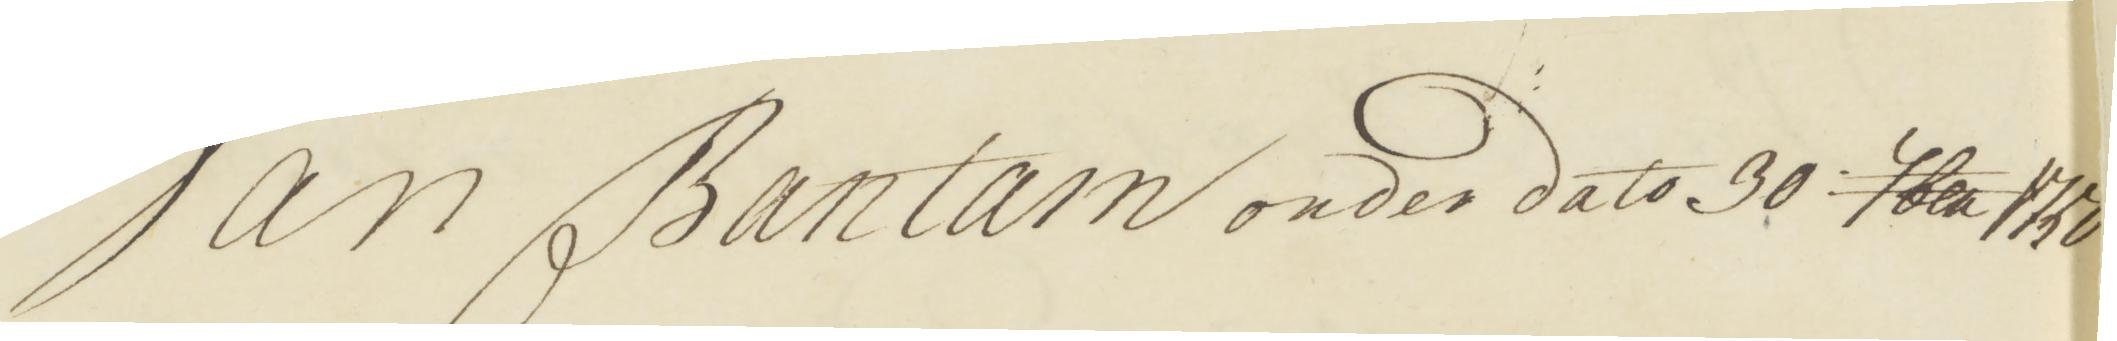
Van Bantam onder dato 30: 7ber 1750
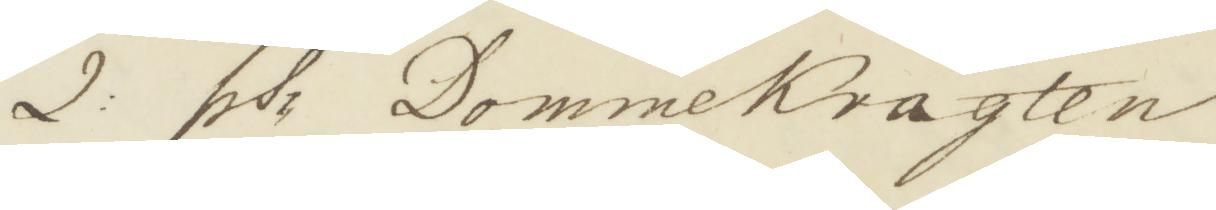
2: p„s Dommekragten
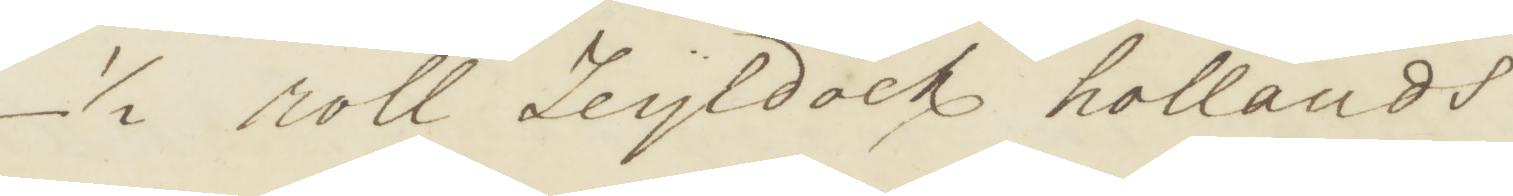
—½ roll zeijldoek hollands
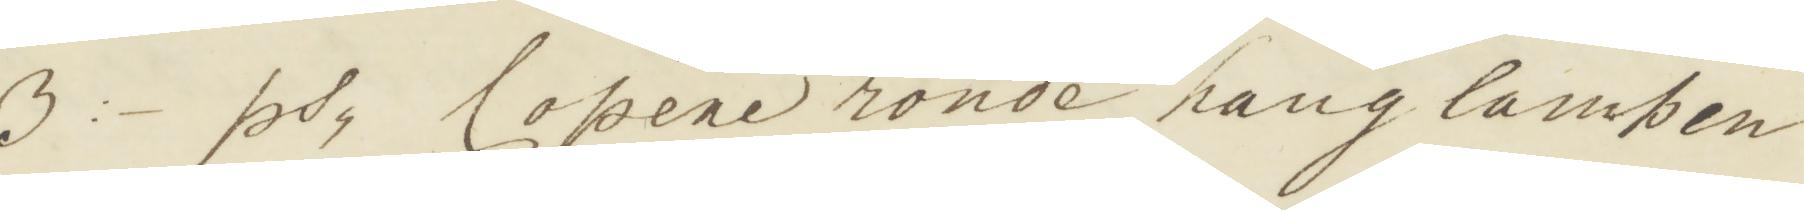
3:- ps„ Copere ronde hang lampen
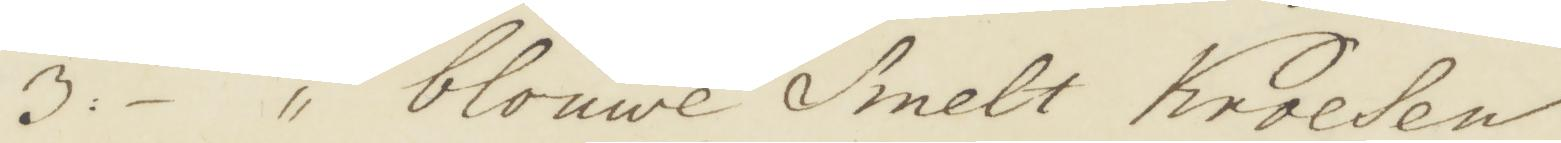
3:- „ blouwe Smelt kroesen
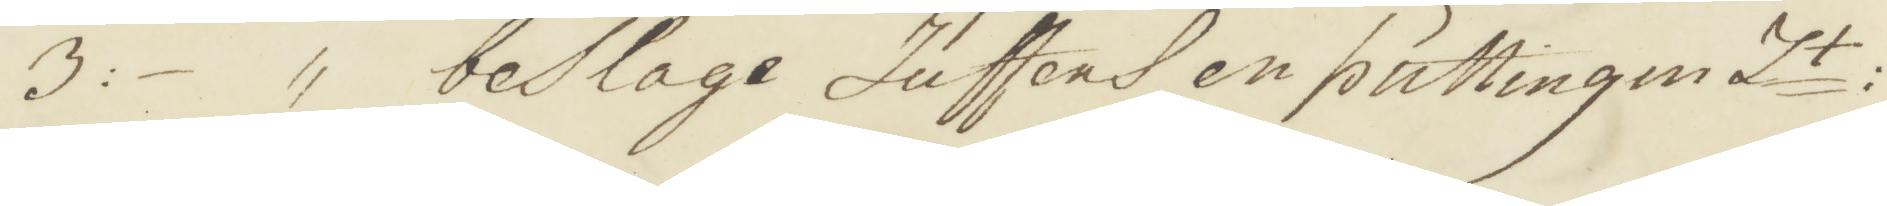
3:- „ beslage Iuffers en puttingen z=t:
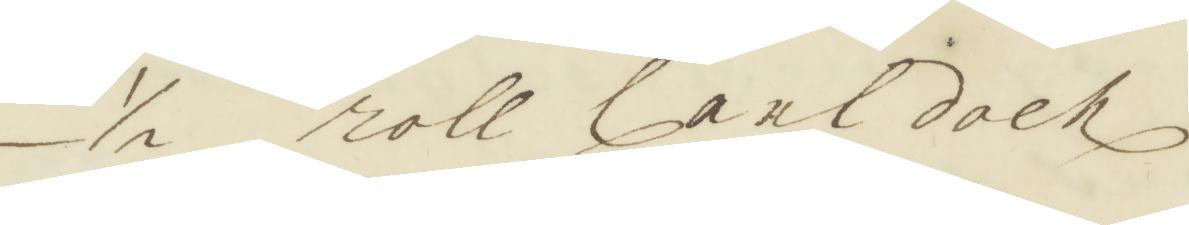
—½ roll Carl doek
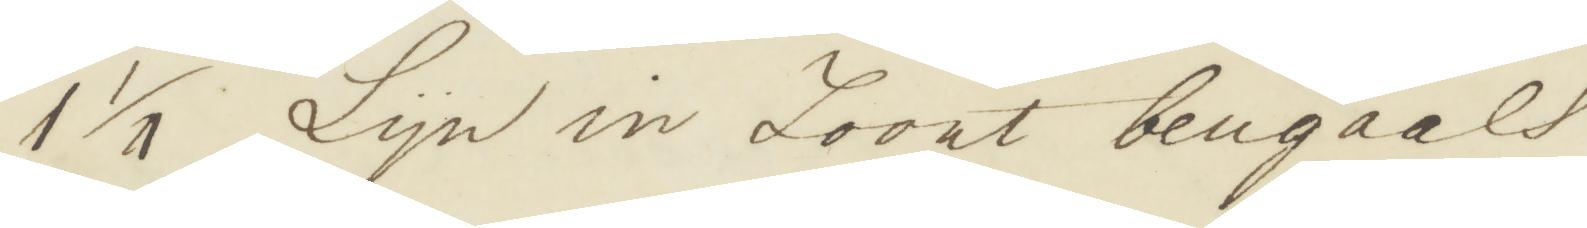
1¼ Lijn in zoort bengaals
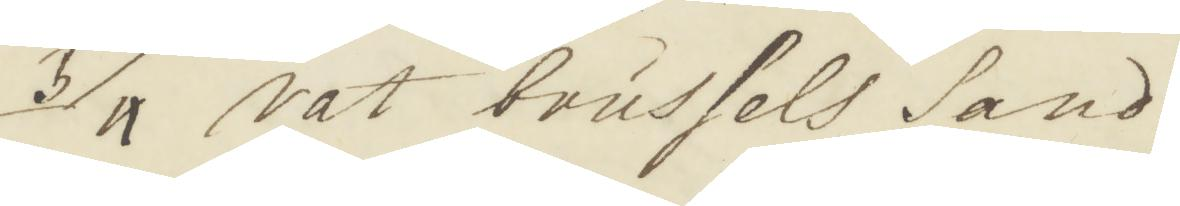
¾ vat brussels sand
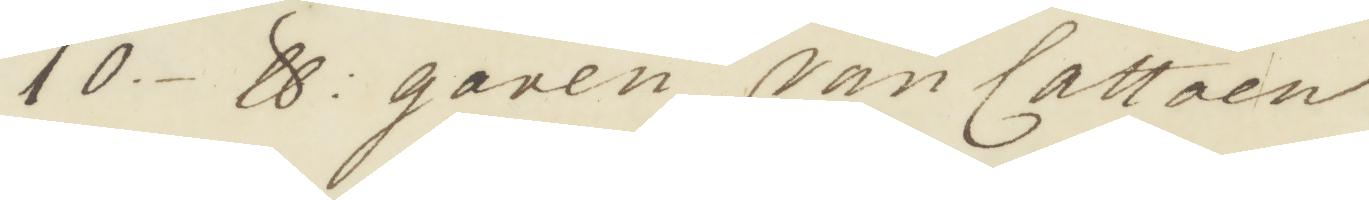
10.- lb: garen van Cattoen
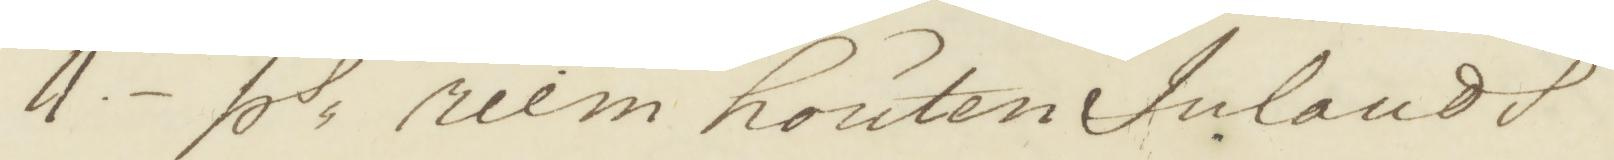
4.– p„s riem houten Inlands
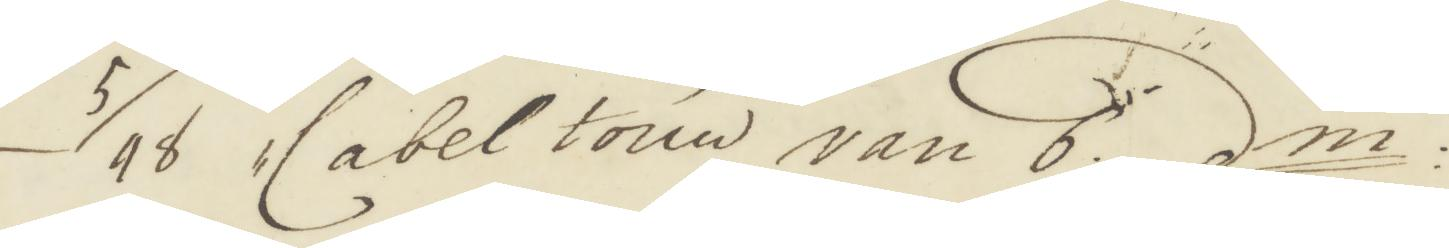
—5/48 Cabel touw van 6. d=m:
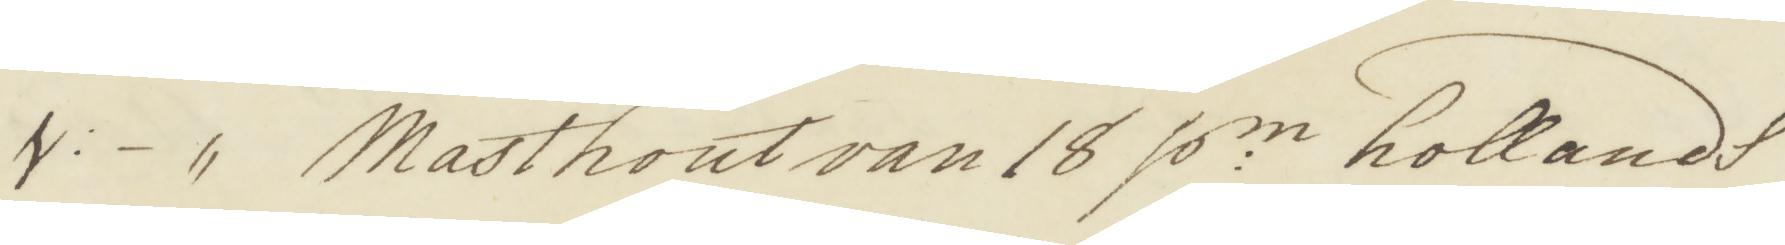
1: – „ Masthout van 18 p:m hollands
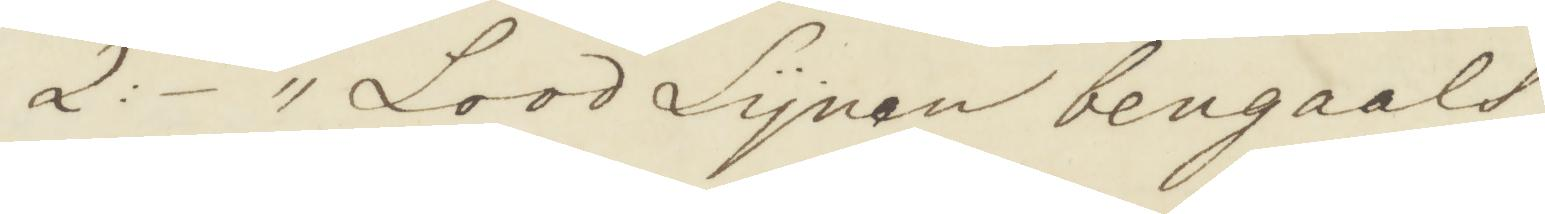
2:— „ Lood Lijnen bengaals
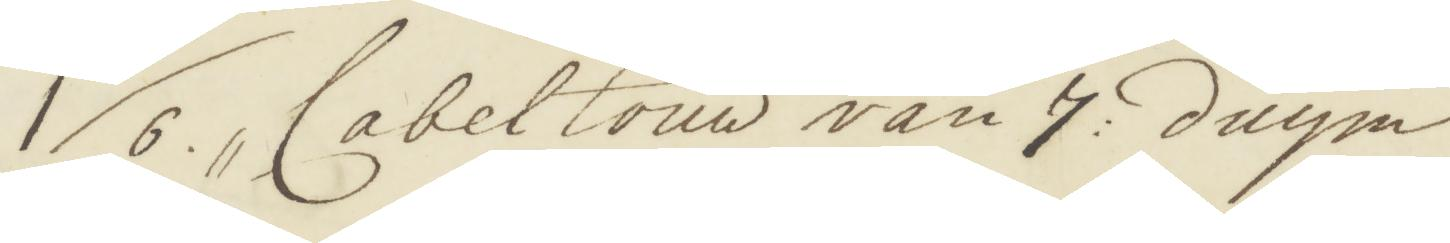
1 1/6.„ Cabeltouw van 7: duijm
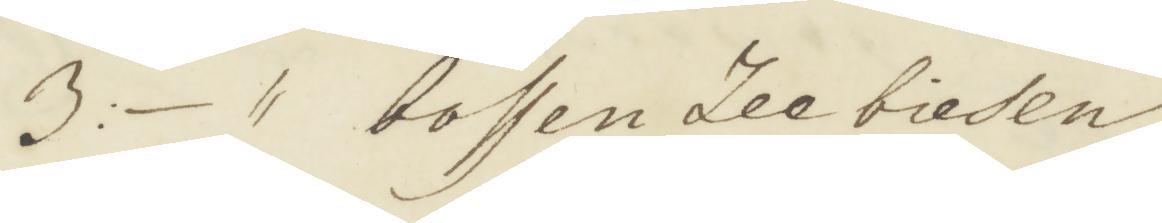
3:— „ bossen zee biesen
